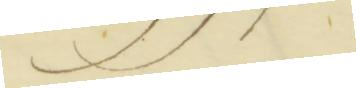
99/
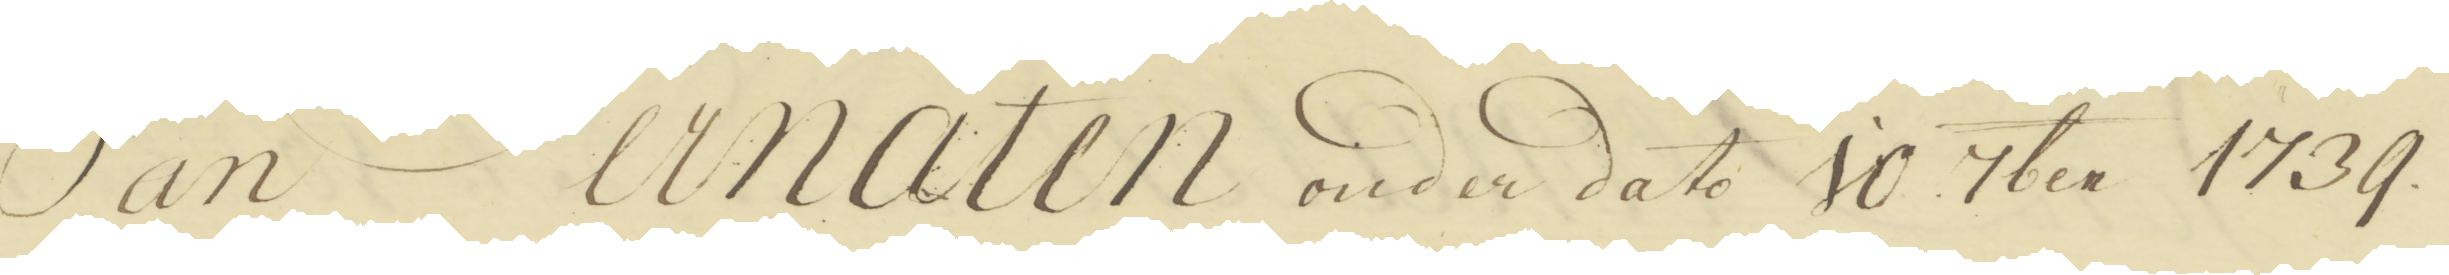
Van Ternaten onder dato 10. 7ber 1739.
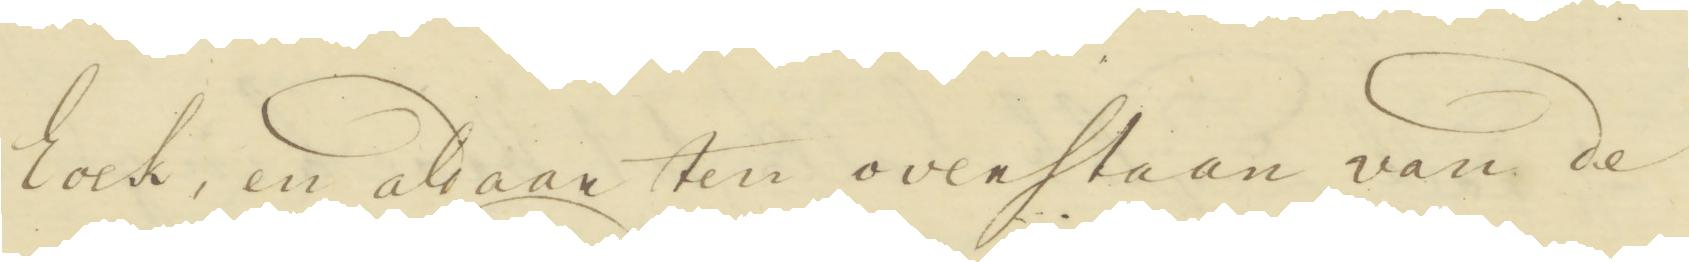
hoek, en aldaar ten overstaan van de
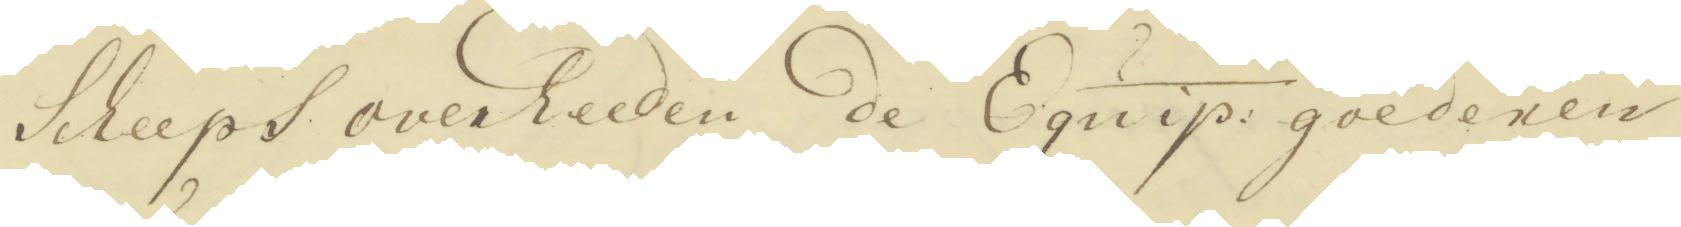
scheeps overheeden de Equip: goederen
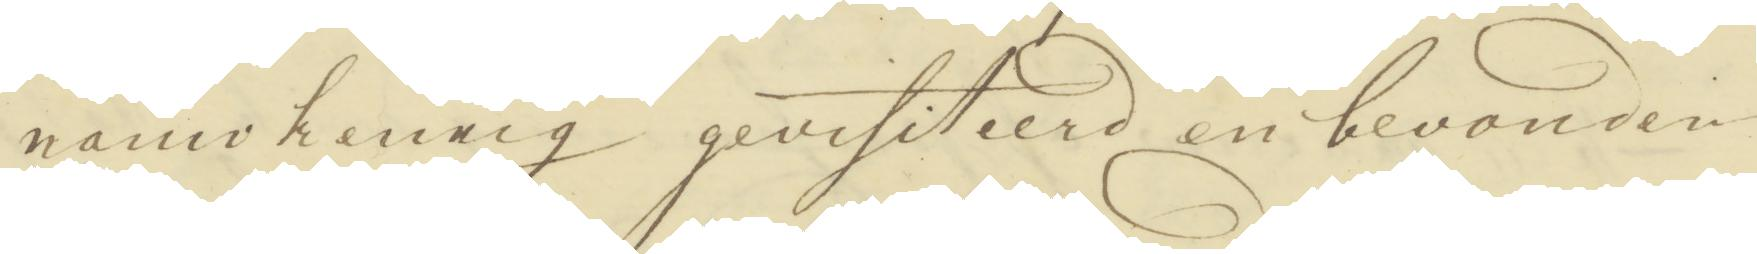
nauwkeurig gevisiteerd en bevonden
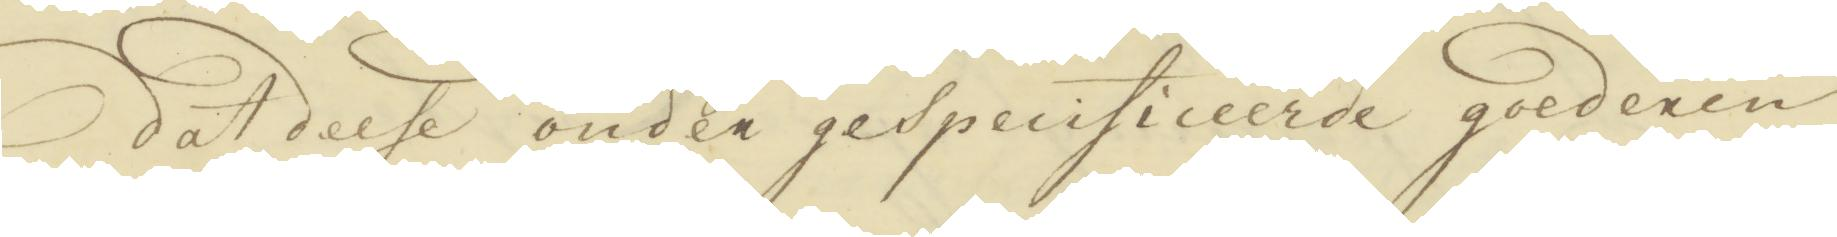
dat deese onder gespecificeerde goederen
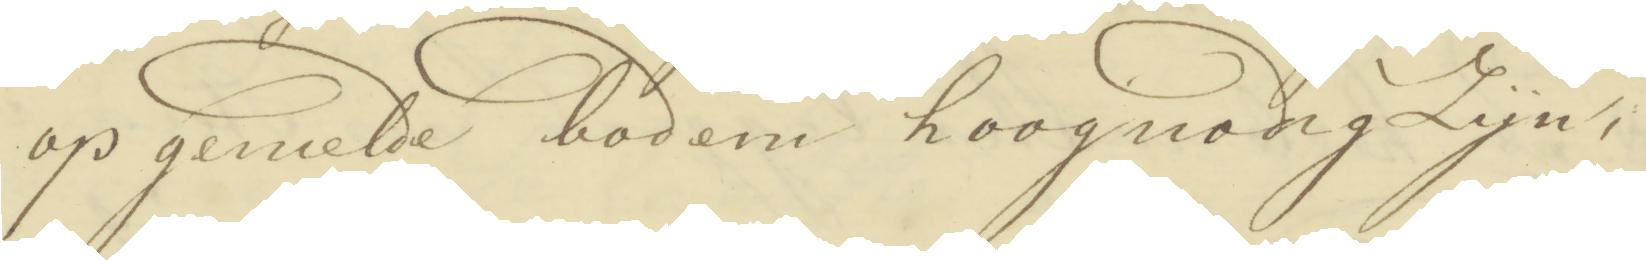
op gemelde bodem hoognodig zijn,
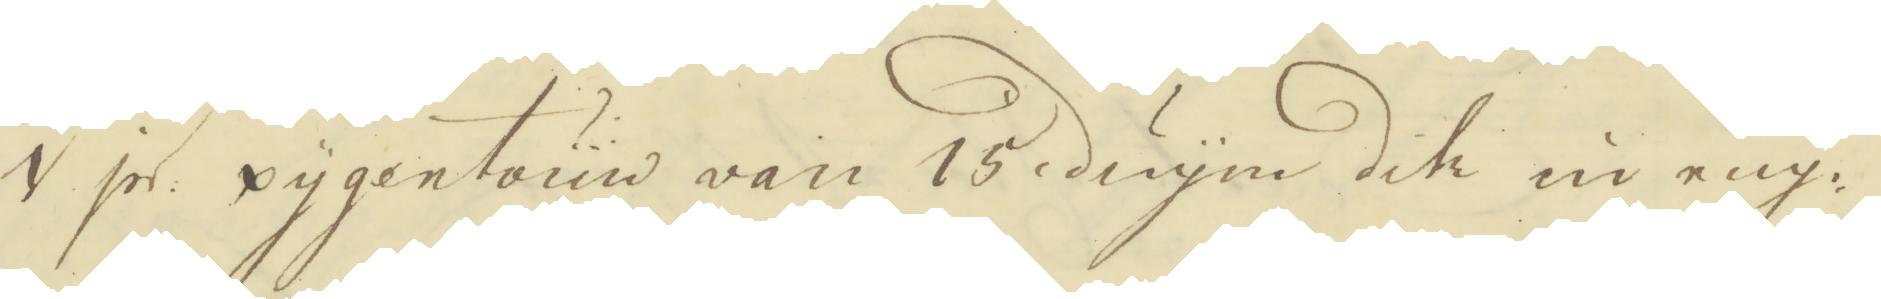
1 ps: vijgentouw van 15 duijm dik in ruij„
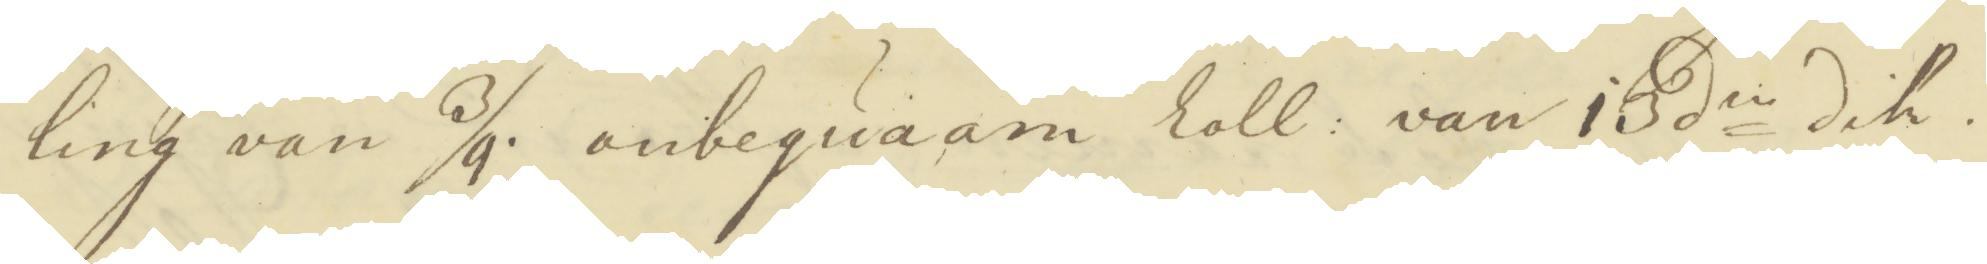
ling van ¾. onbequaam holl: van 13 d=m dik
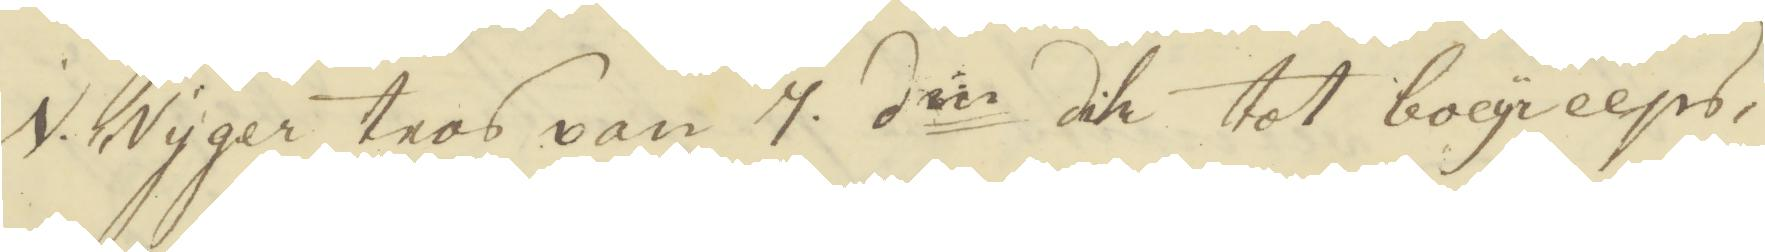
1: „ vijger tros van 7. d=m dik tot boeijreeps,
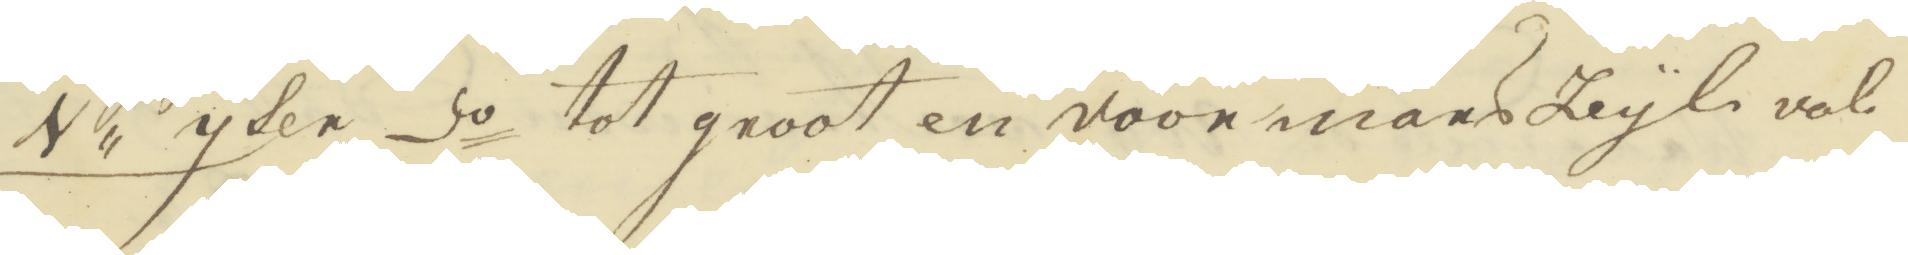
1 „ ijser _=o tot groot en voor mans zeijl vol
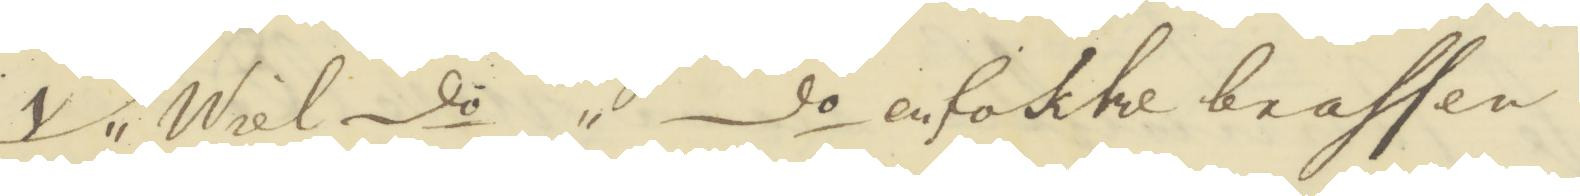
1 „ Wiel _-o „ _-o en fokke brassen
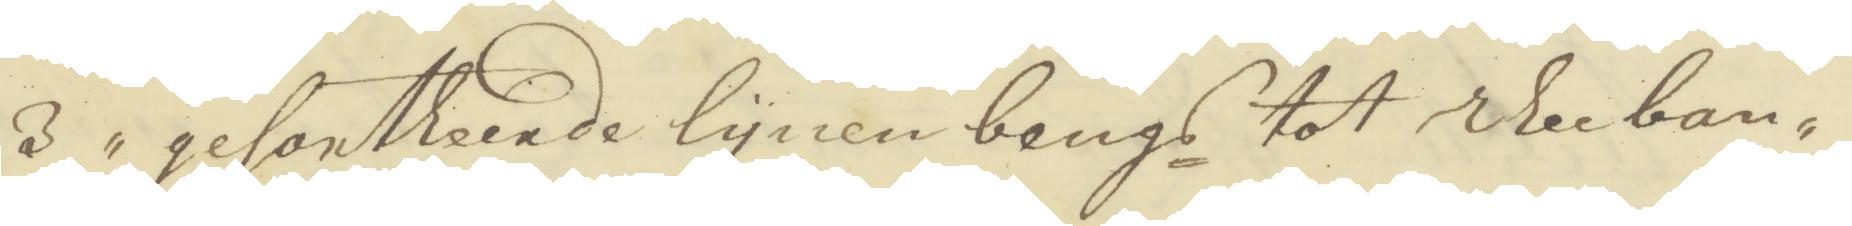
3 „ gesortheerde lijnen beng=s tot rheeban„
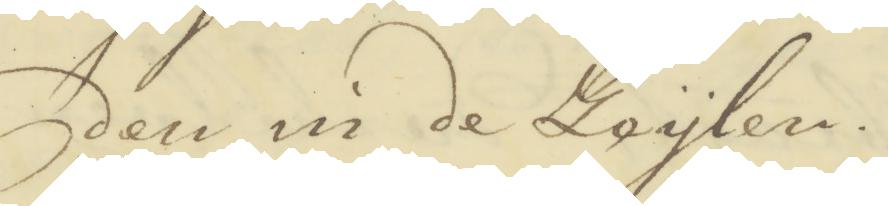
den in de zeijlen.
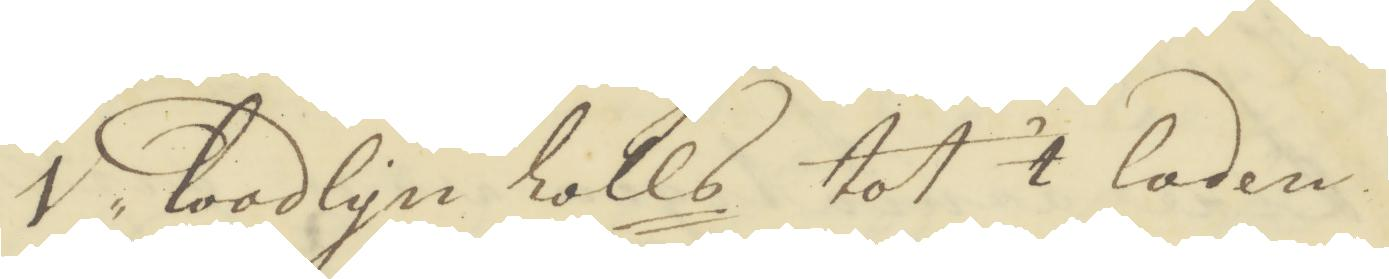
1 „ loodlijn holl=s tot ’t laden
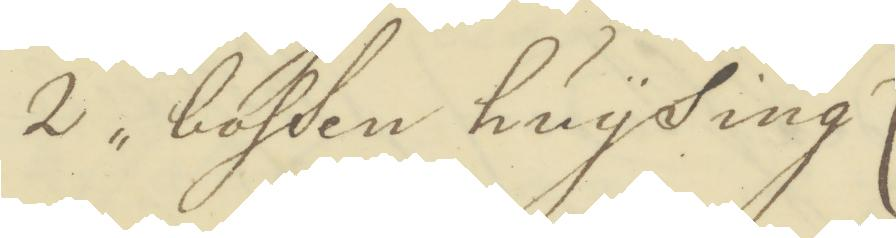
2 „ bossen huijsing
